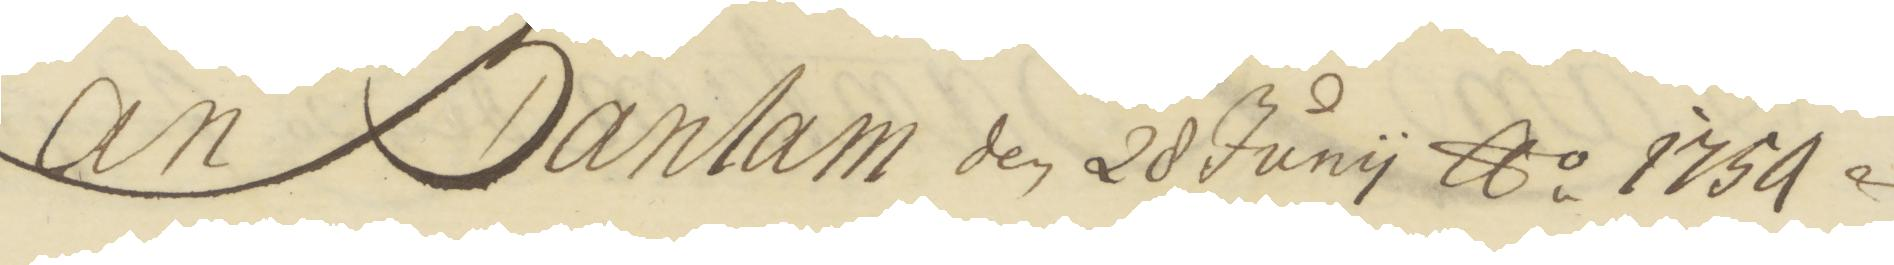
Van Bantam den 28 Junij A„o 1754
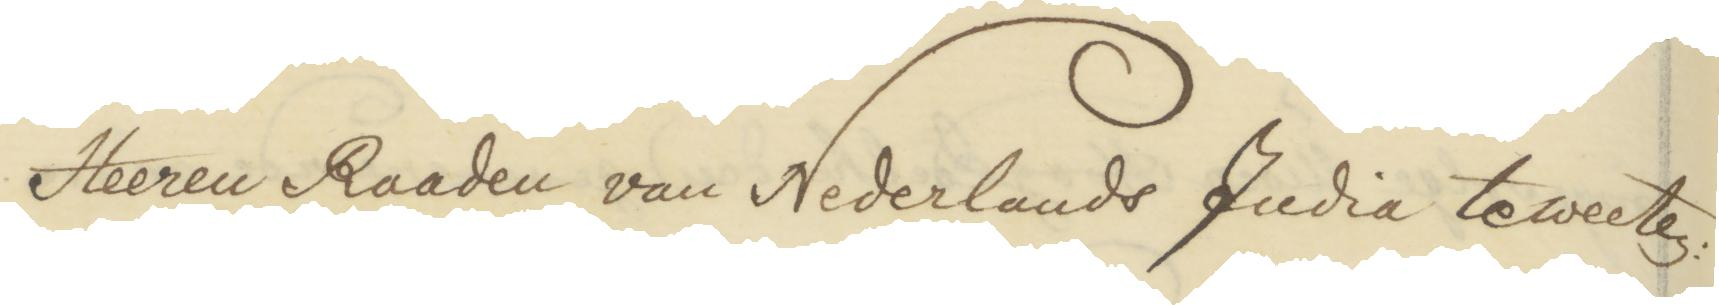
Heeren Raaden van Nederlands Jndia te weeten
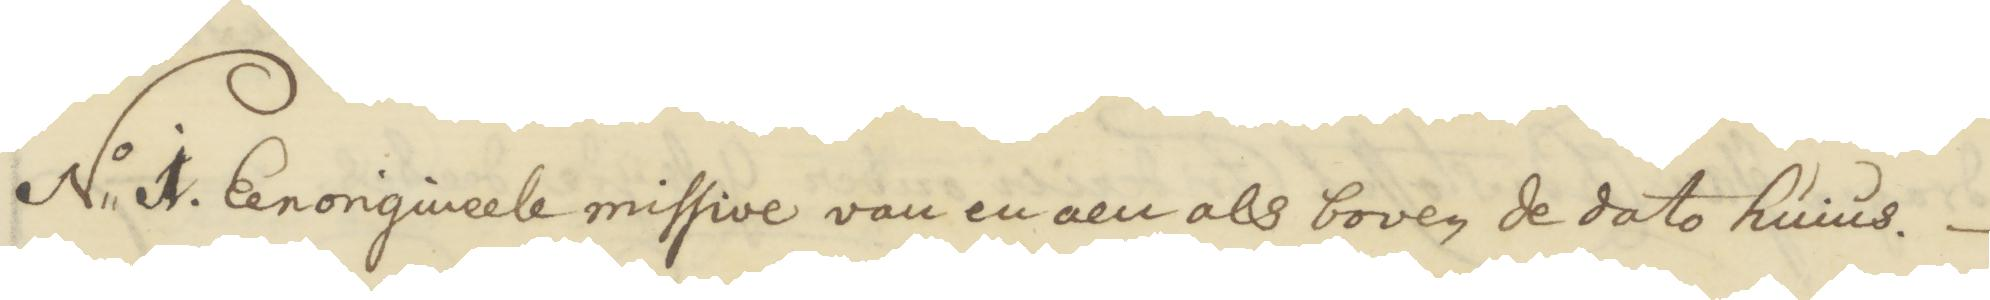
N„o 1. Een origineele missive van en aen als boven de dato huius. —
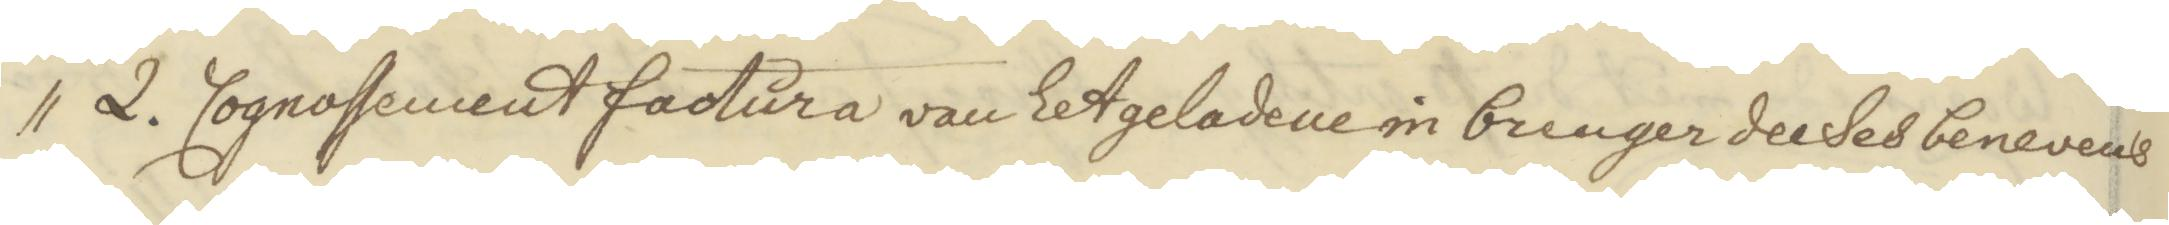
„ 2. Cognossement factura van het geladene in brenger deeses benevens
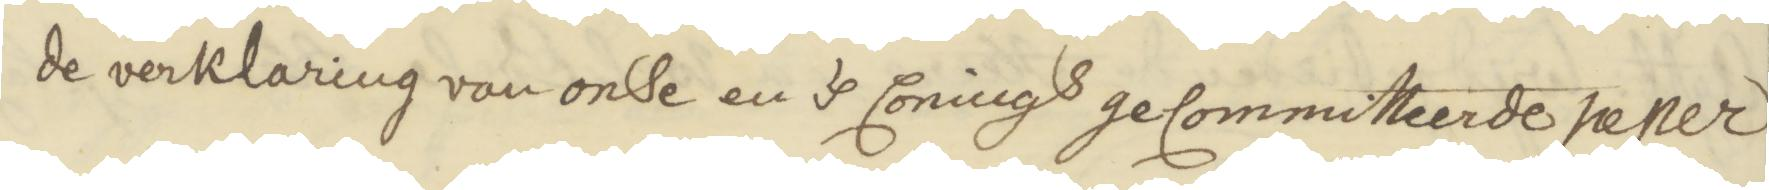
de verklaring van onse en 's Conings gecommitteerde peper
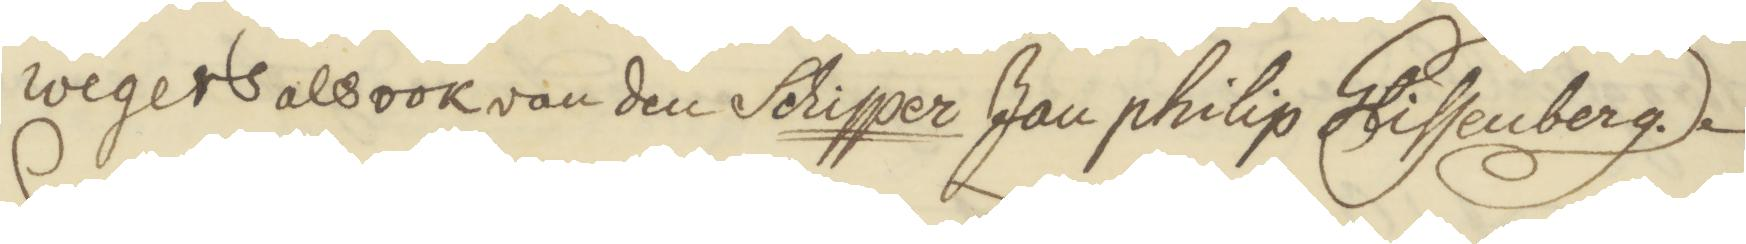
wegers als ook van den schipper Jan philip Glissenberg. —
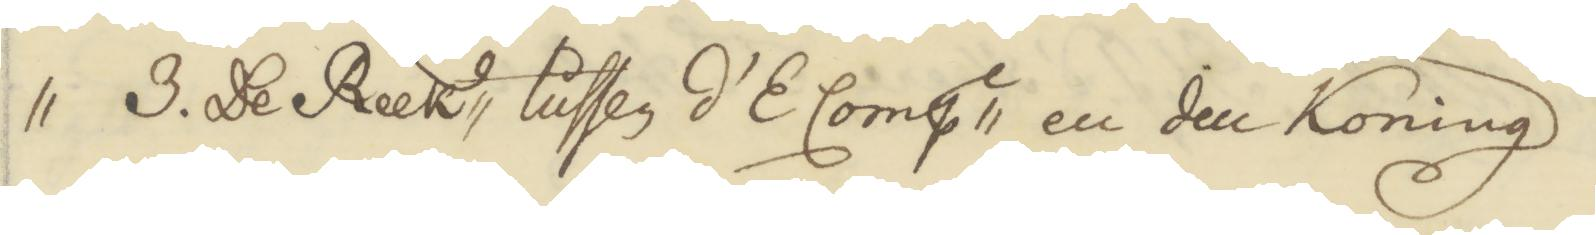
„ 3. De Reek„g tussen d’ E Comp„e en den koning
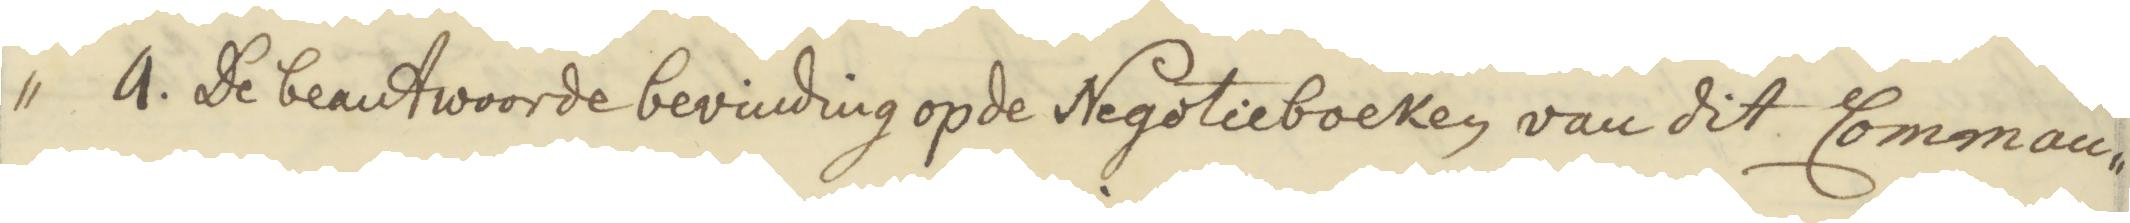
„ 4. De beantwoorde bevinding op de Negotieboeken van dit Comman„
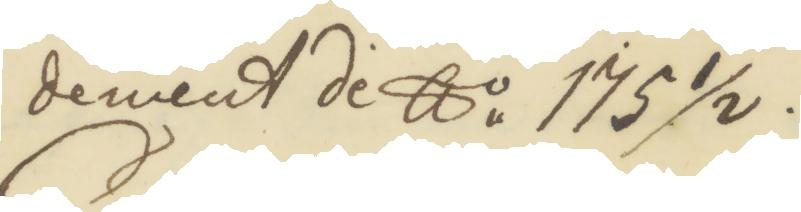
dement de A„o 1751/2
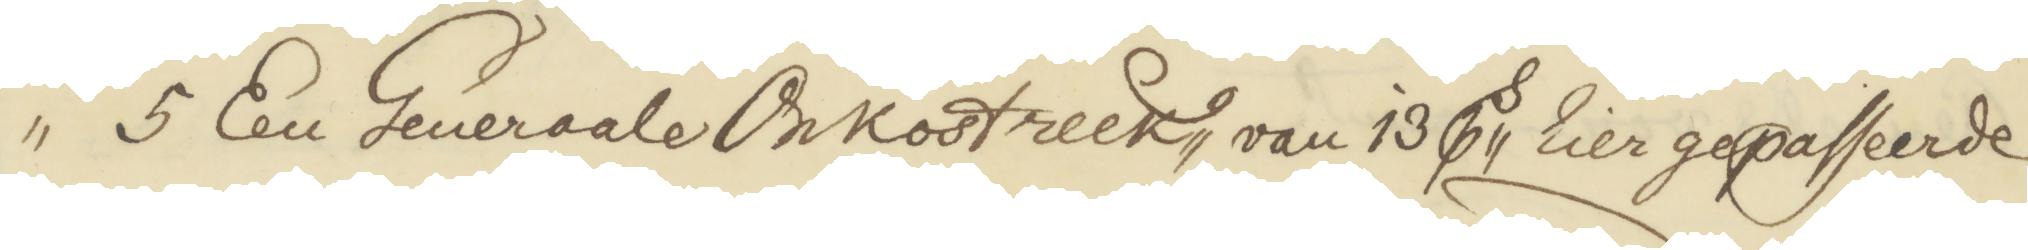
„ 5 Een Generaale Onkost reek„g van 13 p„s hier gepasseerde
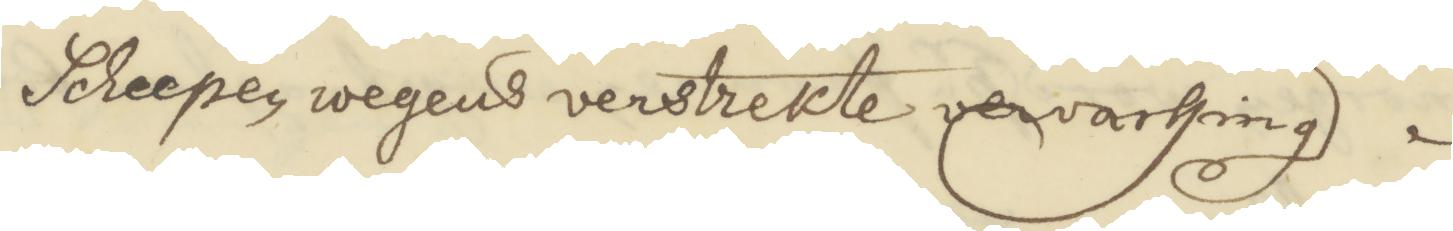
scheepen wegens verstrekte vervarging
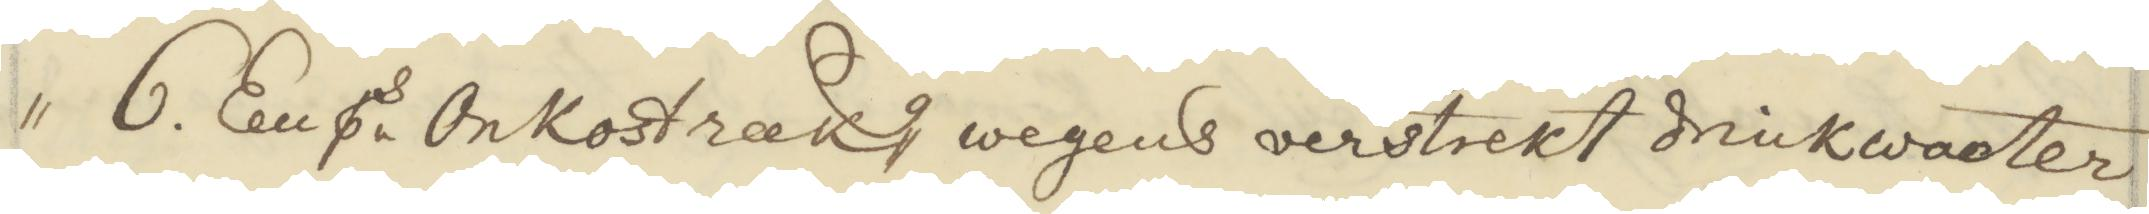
„ 6. Een p„s Onkost reek„g wegens verstrekt drinkwaater
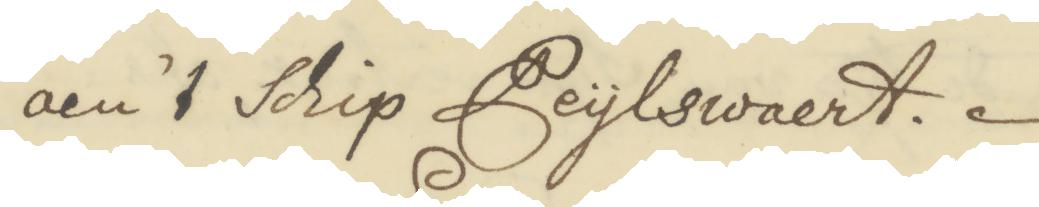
aen ’t schip Peijlswaert. —
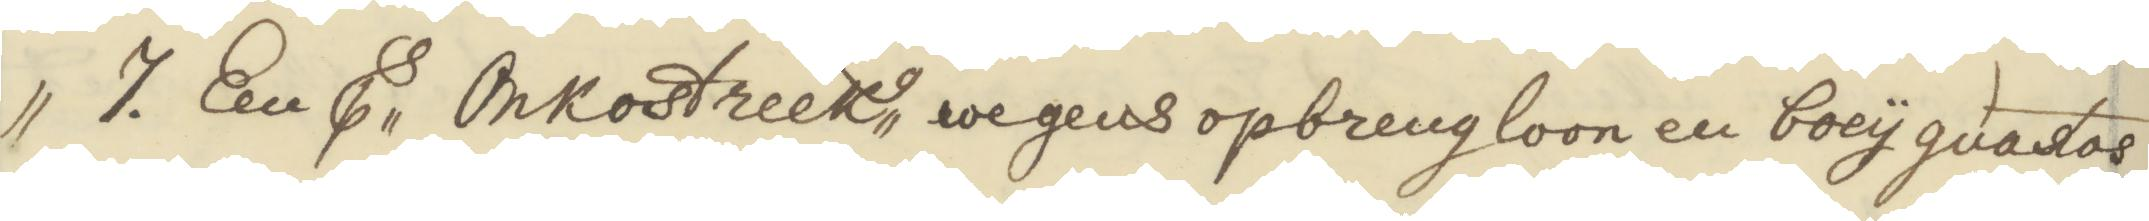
„ 7. Een p„s Onkost reek„g wegens opbreng loon en boeij guastos
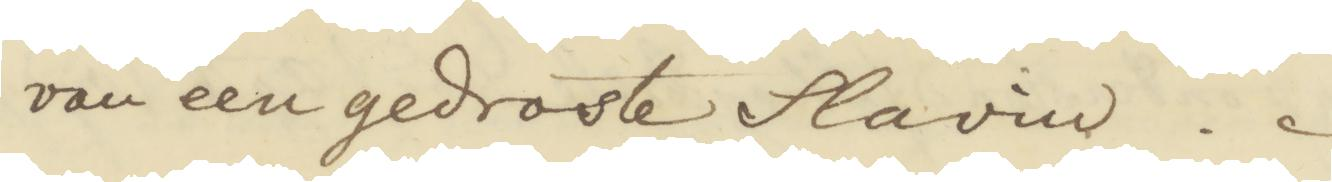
van een gedroste slavin.
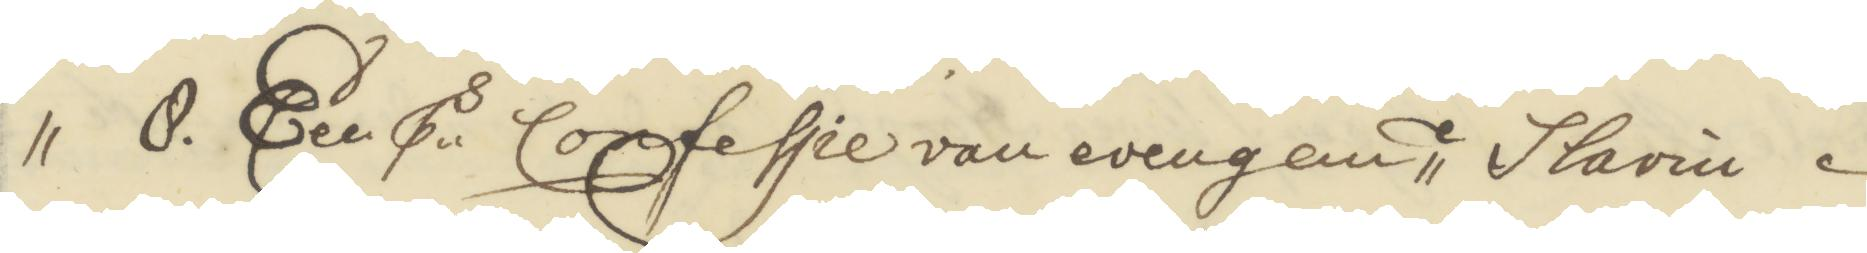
„ 8. Een p„s Confessie van evengem„e slavin
